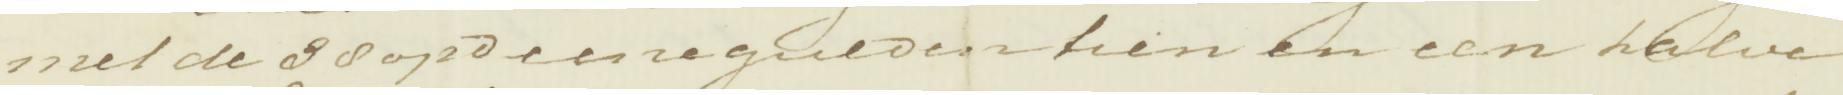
met de 38 opc eene gulden tien en een halve
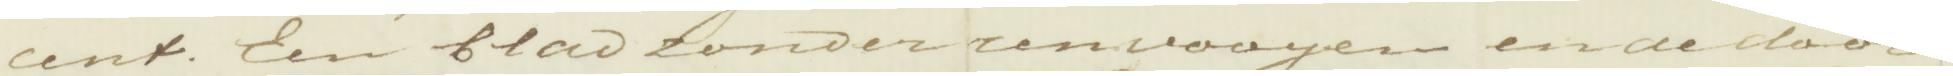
cent. Een blad zonder renvooyen en de door
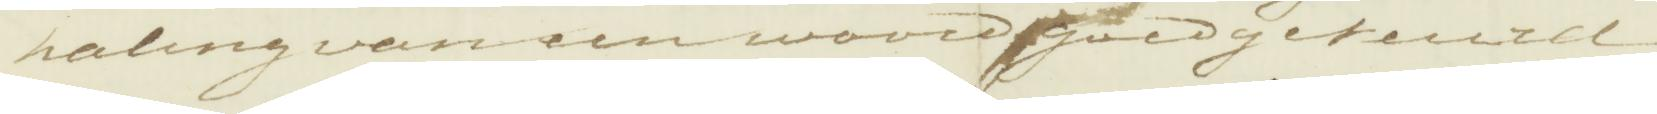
haling van een woord goedgekeurd
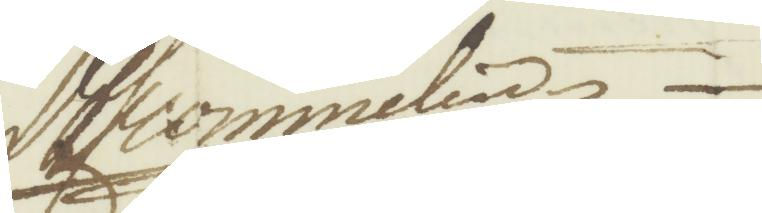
DF Crommelin —
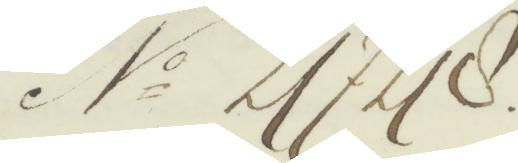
N=o 4748.
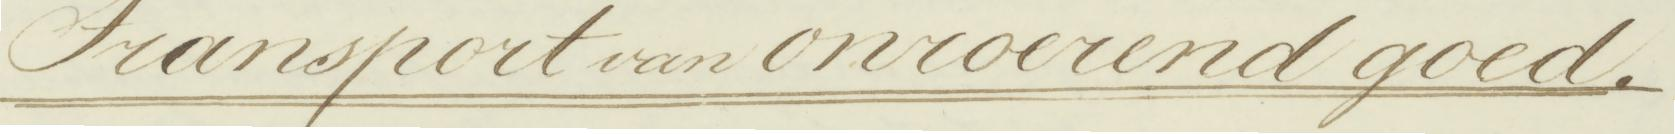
Transport van onroerend goed.
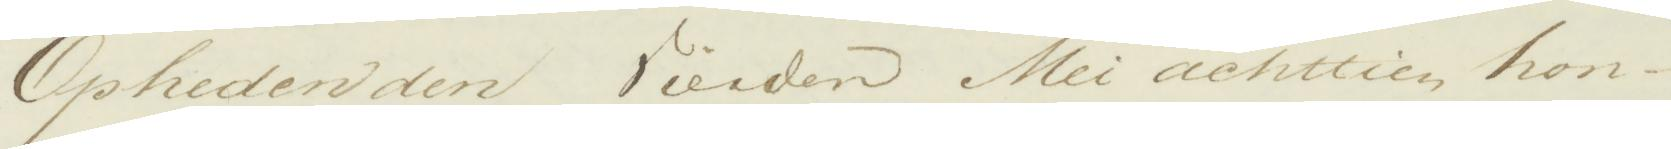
Op heden den Vierden Mei achttien hon-
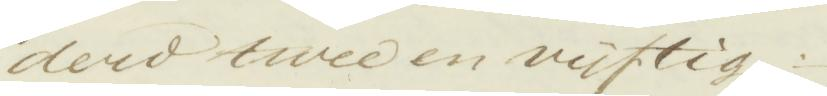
derd twee en vijftig. —
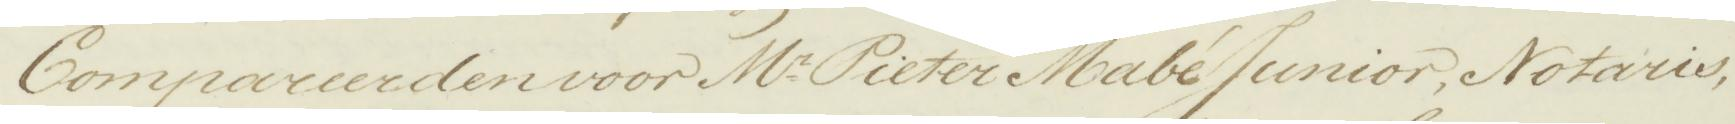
Compareerden voor M:r Pieter Mabé Junior, Notaris,
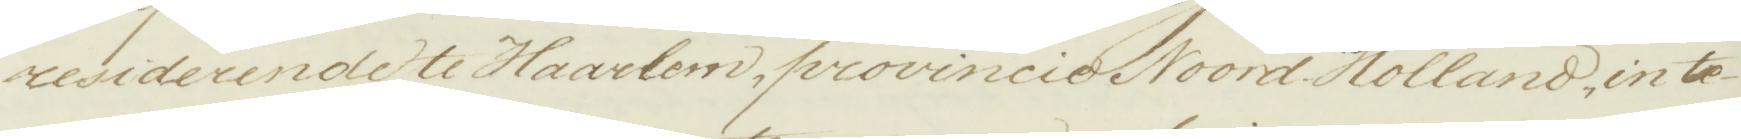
residerende te Haarlem, provincie Noord-Holland, in te-
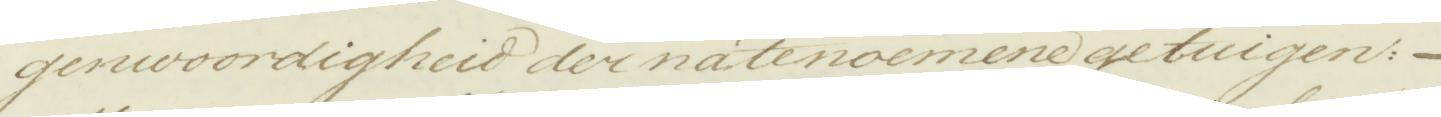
genwoordigheid der natenoemene getuigen: —
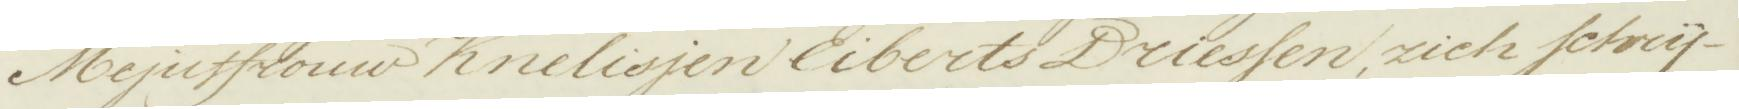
Mejuffrouw Knelisjen Eiberts Driessen, zich schrij-
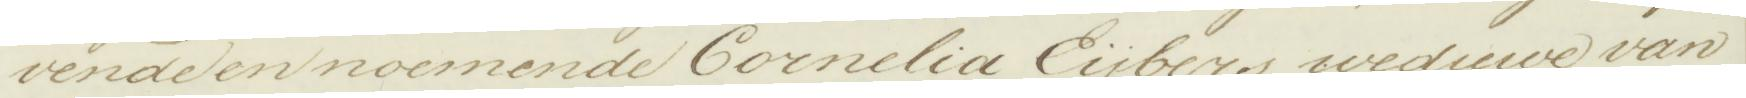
vende en noemende Cornelia Eijbers, weduwe van
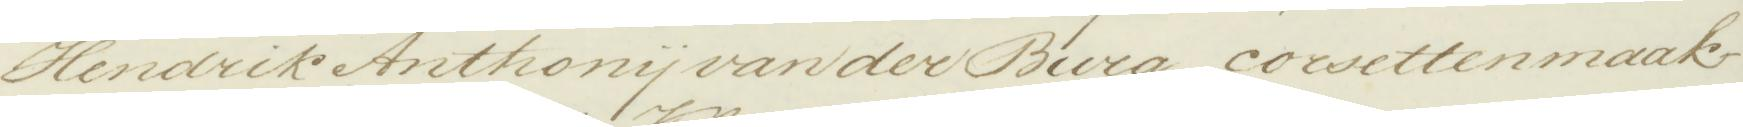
Hendrik Anthonij van der Burg, corsettenmaak-
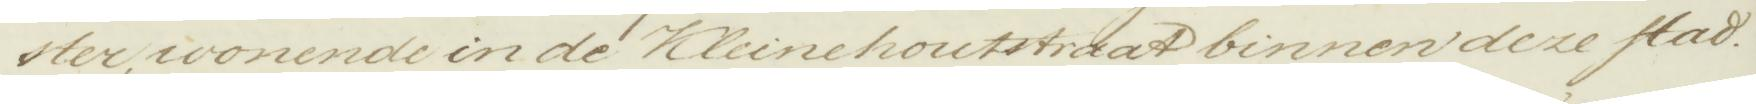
ster, wonende in de Kleinehoutstraat binnen deze stad.
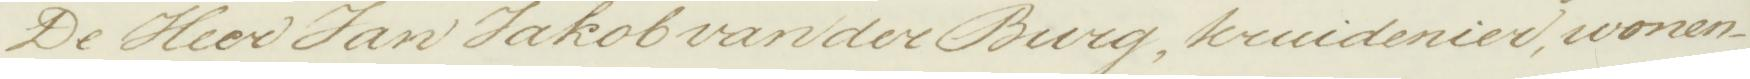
De Heer Ian Iakob van der Burg, kruidenier, wonen-
